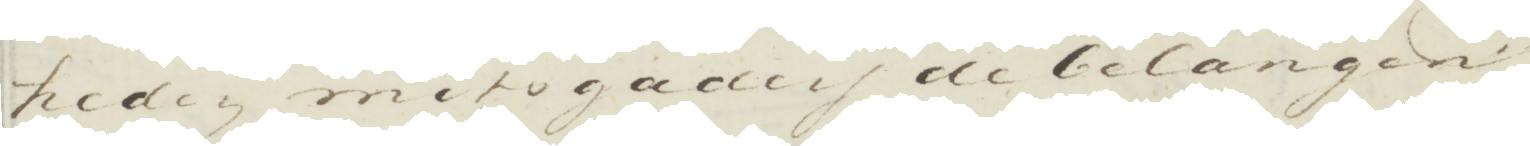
heden mitsgaders de belangen
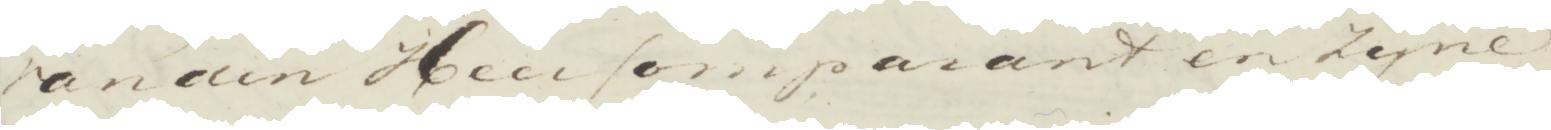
van den Heer Comparant en zyne
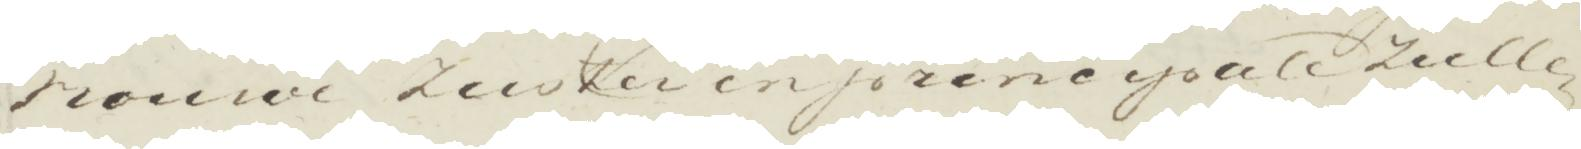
vrouwe Zuster en principale zullen
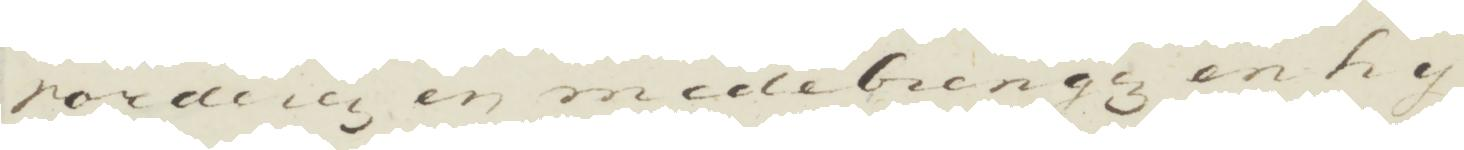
vorderen en medebreng en hy
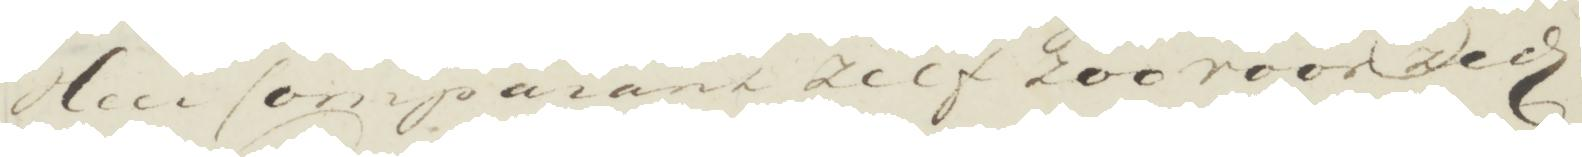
Heer Comparant zelf zoo voor zich
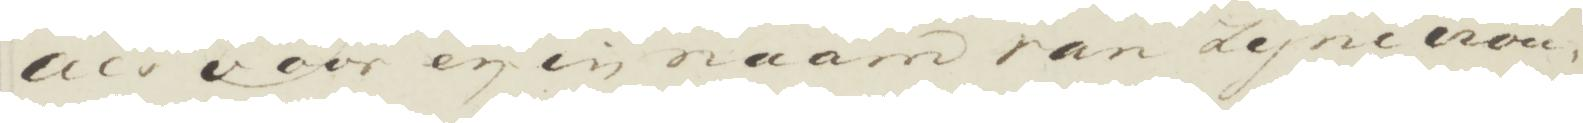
als voor en in naam van zyne vrou,
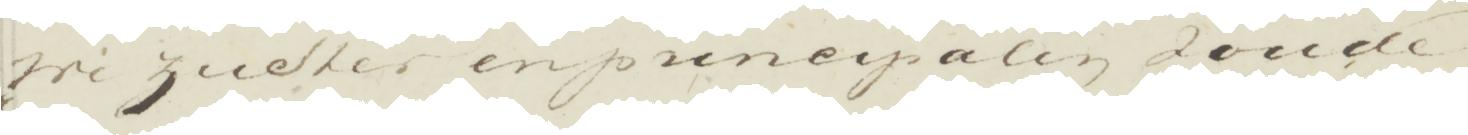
„we zuster en principalen zoude
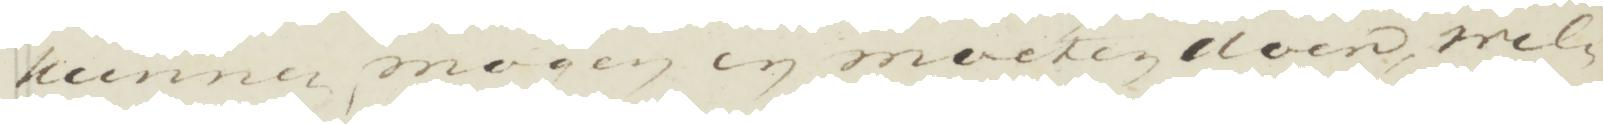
kunnen, mogen en moeten doen, wil„
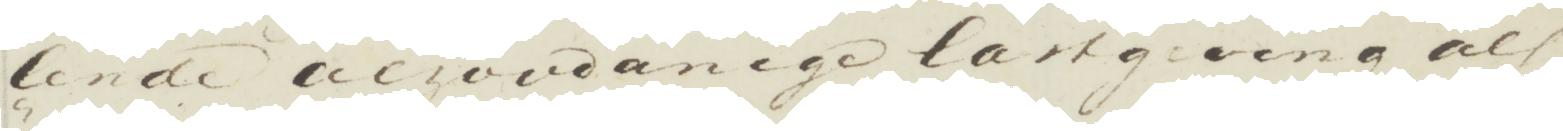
„lende alzoodanige lastgeving als
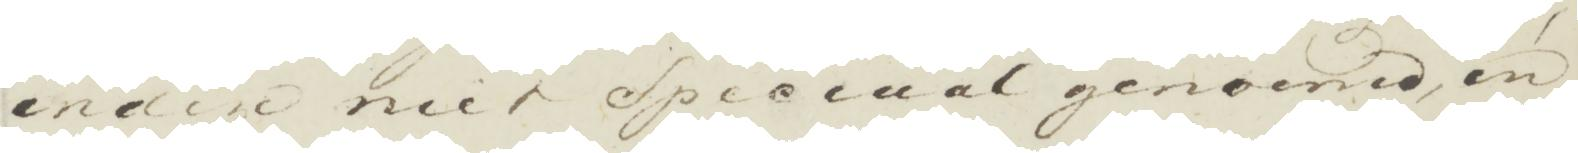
in deze niet speciaal genoemd, en
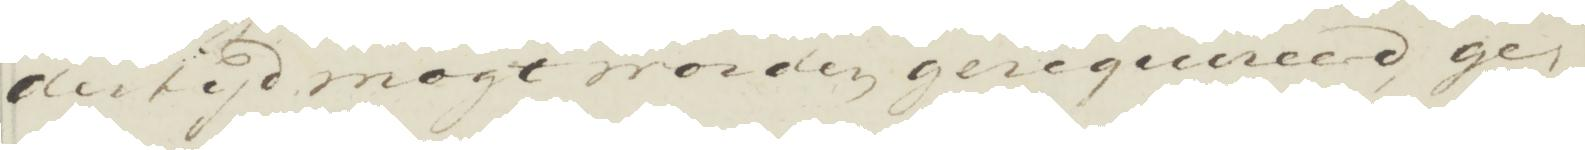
der tyd mogt worden gerequireerd, ge,
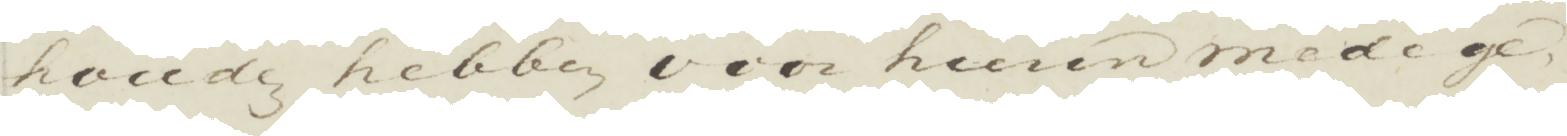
„houden hebben voor hierin mede ge„
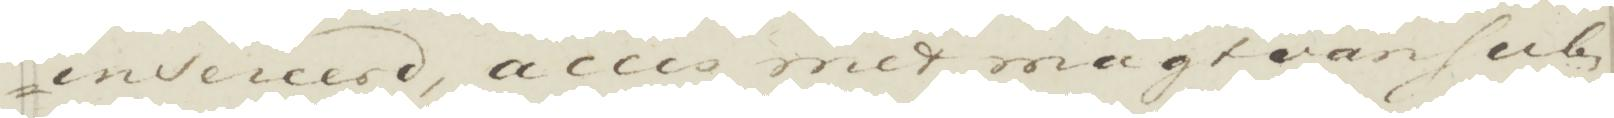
„insereerd, acces met magt van sub,
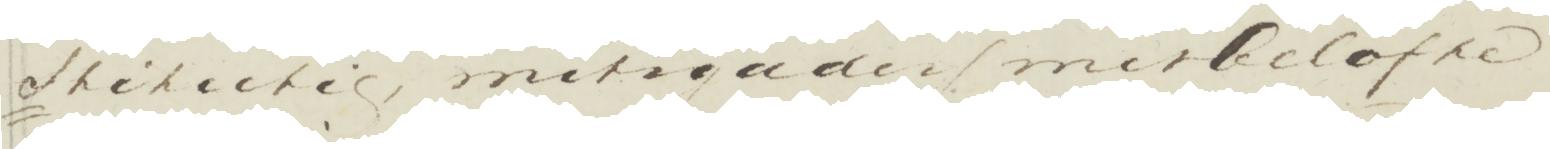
„stitutie, mitsgaders met belofte
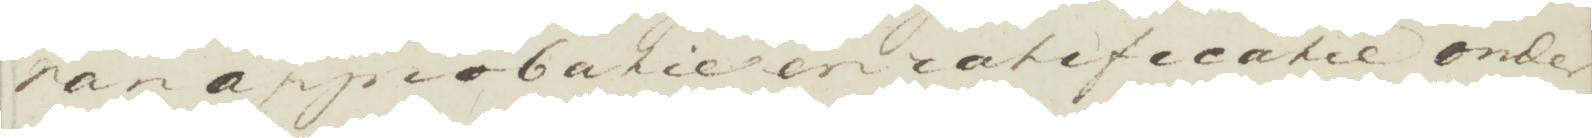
van approbatie en ratificatie onder
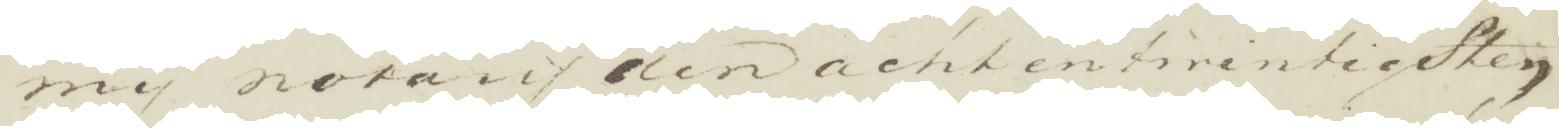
my notaris den acht en twintigsten
